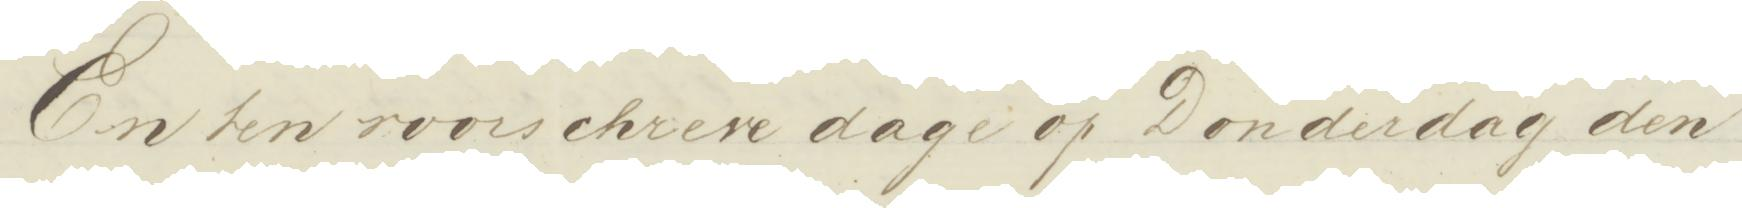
Een ten voorschreve dage op Donderdag den
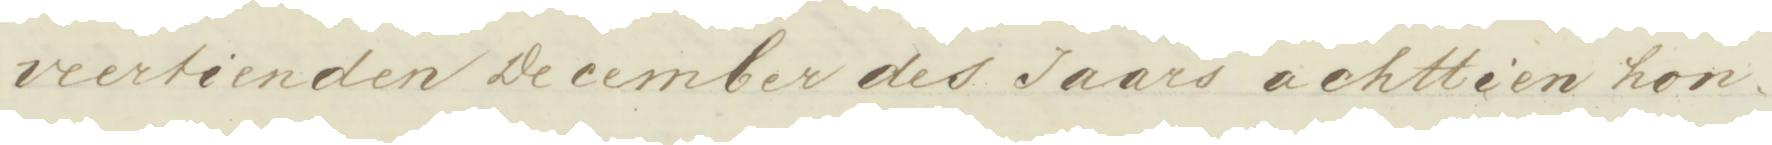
veertienden December des Jaars achttien hon„
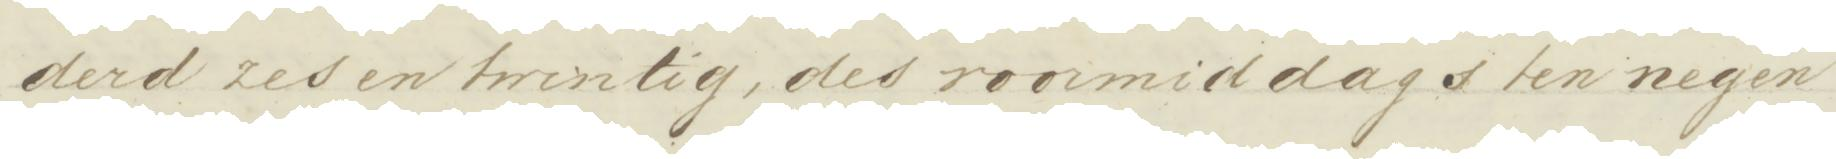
derd zes en twintig, des voormiddags ten negen
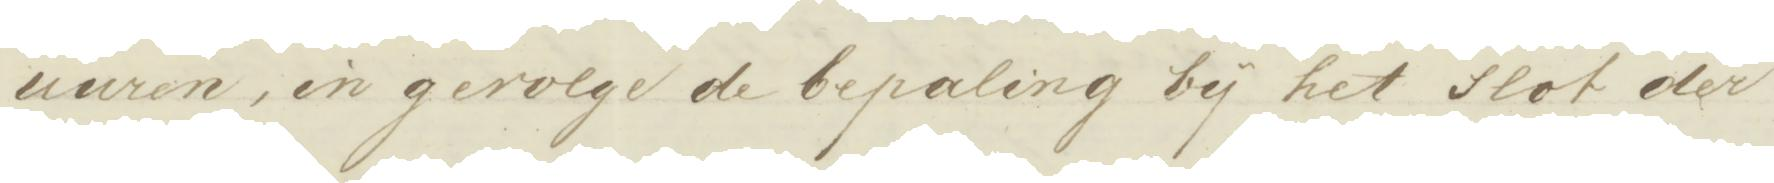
uuren, in gevolge de bepaling bij het slot der
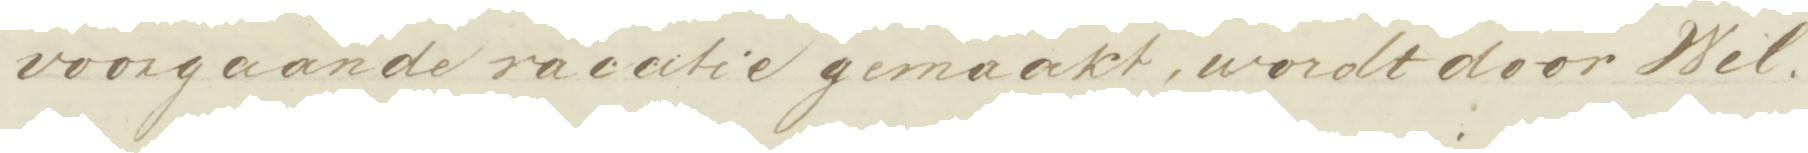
voorgaande vacatie gemaakt, wordt door Wil„
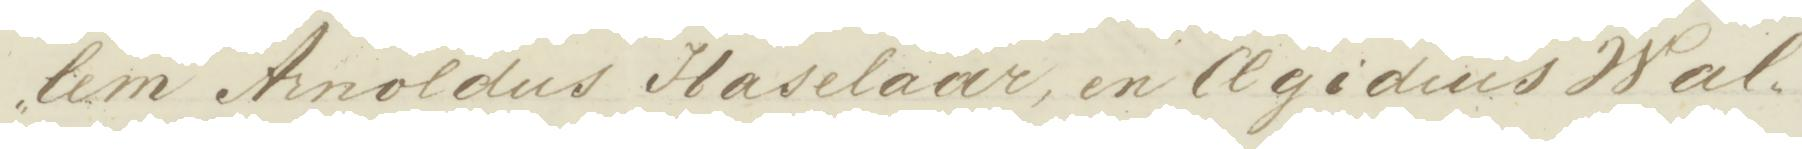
„lem Arnoldus Haselaar, en Aegidius Wal„
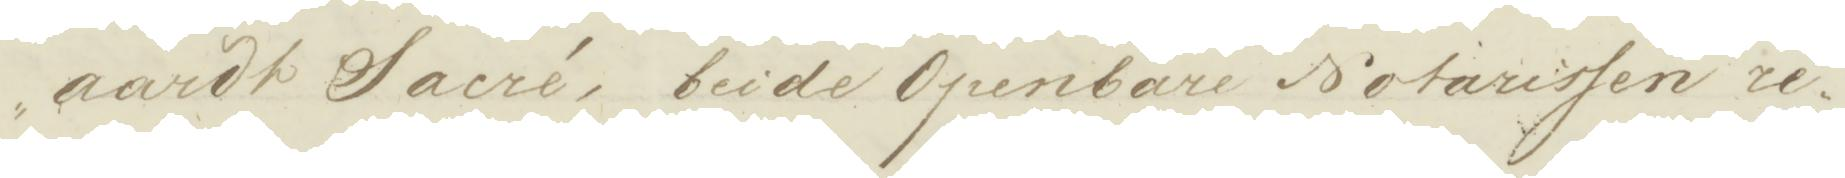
„aardt Sacré, beide Openbare Notarissen re„
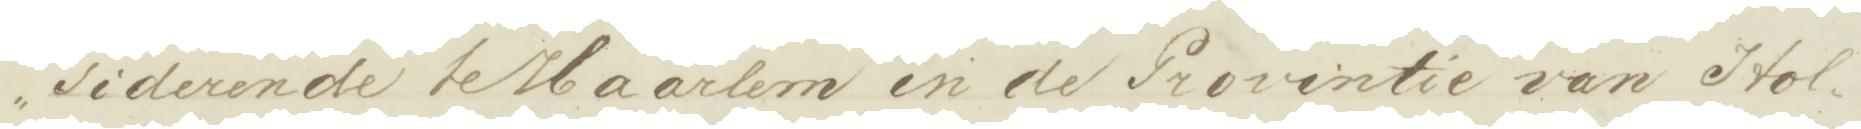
„siderende te Haarlem in de Provintie van Hol„
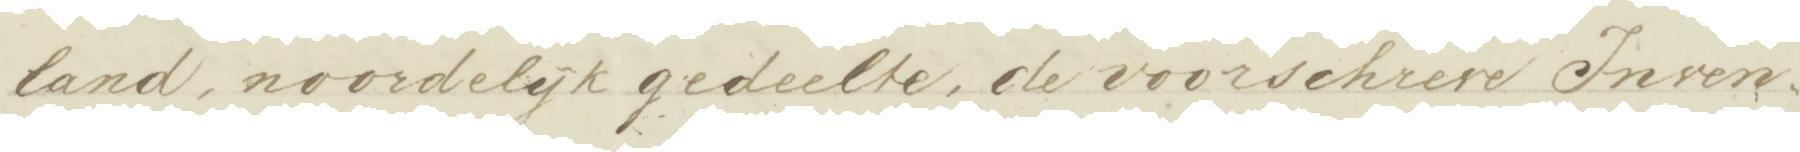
land, noordelijk gedeelte, de voorschreve Inven„
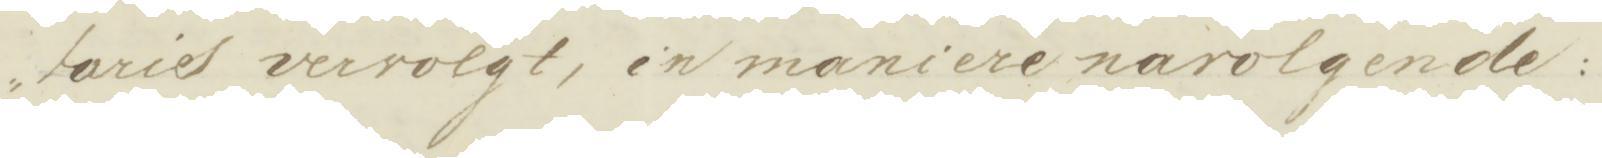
„taris vervolgt, in maniere navolgende:
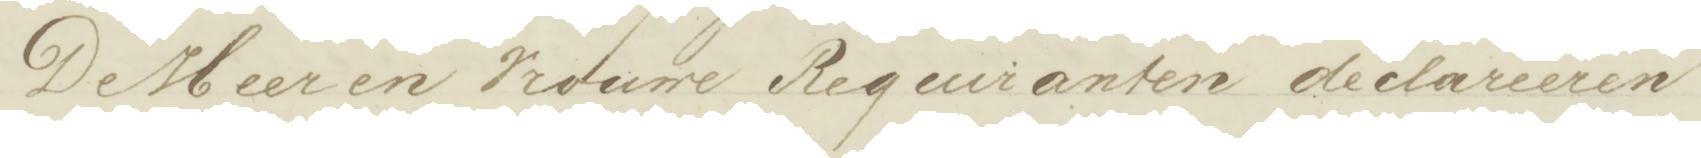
De Heer en Vrouwe Requiranten declareeren
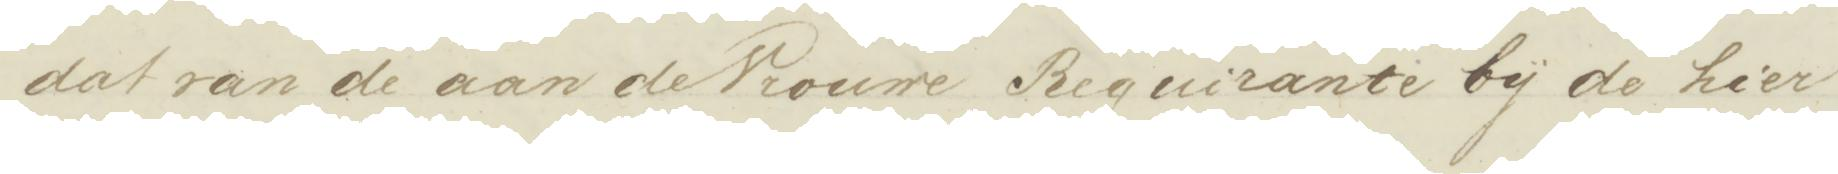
dat van de aan de Vrouwe Requirante bij de hier
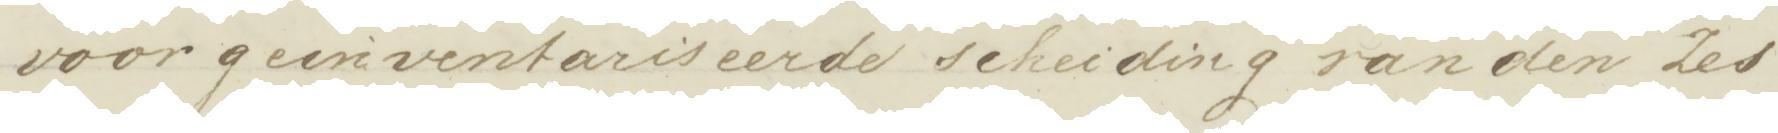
voor geinventaris eerde scheiding van den Zes
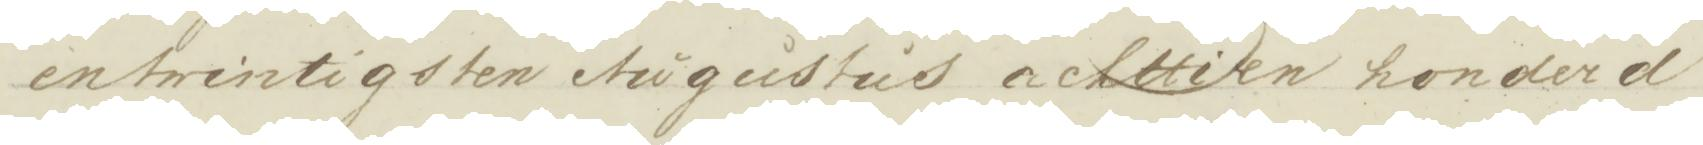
en twintigsten Augustus achttien honderd
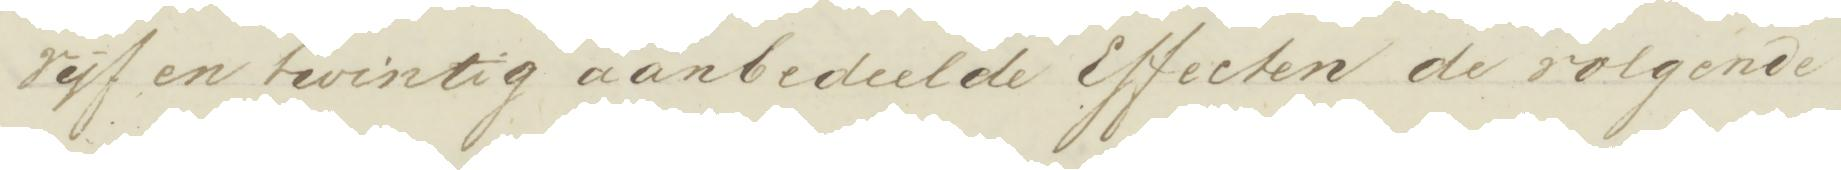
vijf en twintig aanbedeelde Effecten de volgende
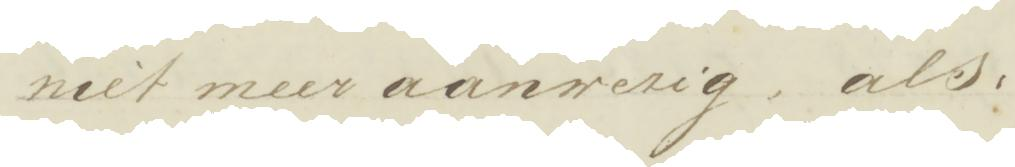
niet meer aanwezig, als.
